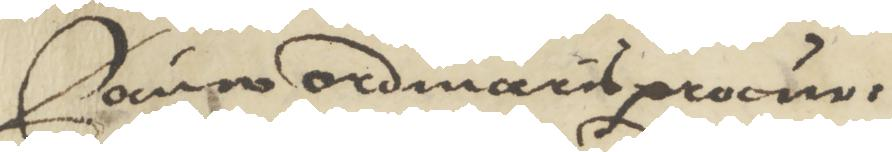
Pauw ordinaris procur:
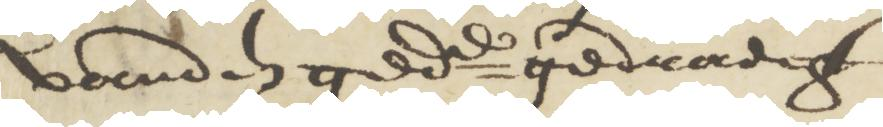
van den ged=e gedraecht
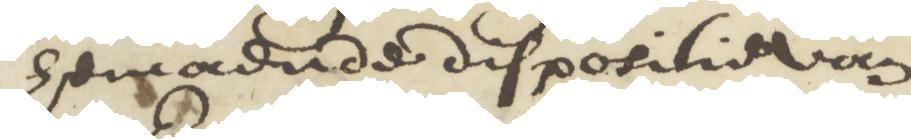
hem aende dispositie van
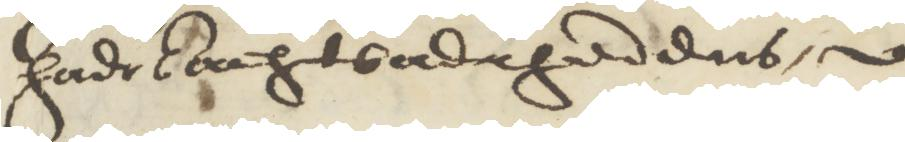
haer E achtbaarhedens, —
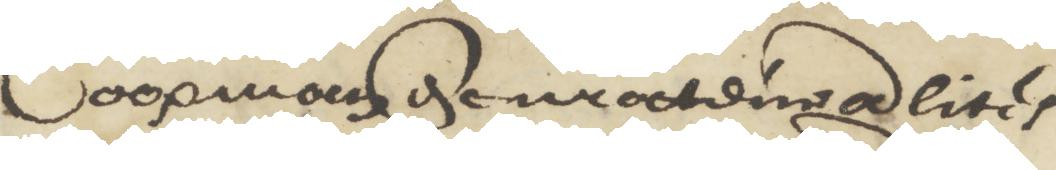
Coopman ende curateur ad lites
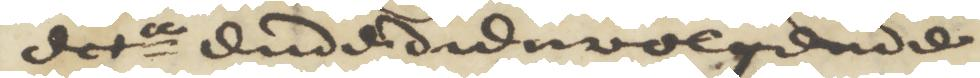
ect=a ende dienvolgende
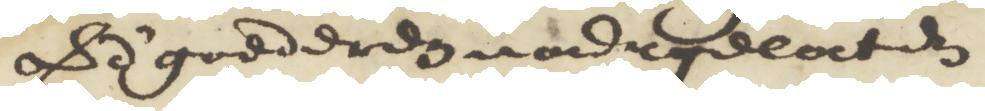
over d’goederen naergelaten
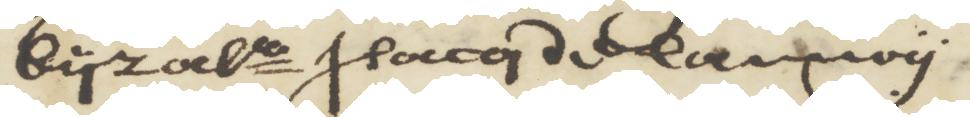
bij zal=r jsacq de lannoij
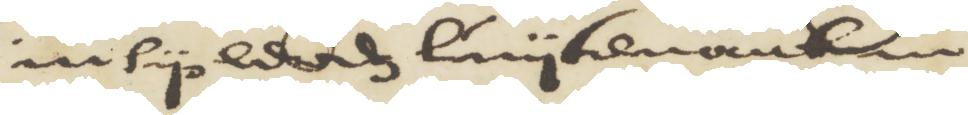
in sijn leven luijtenant in
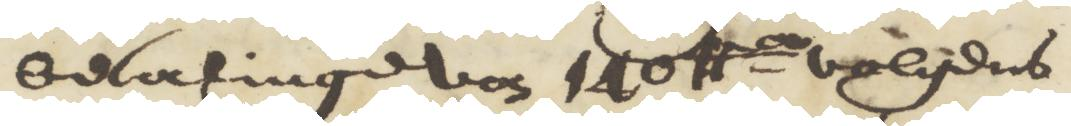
betalinge van 140 R=a volgens
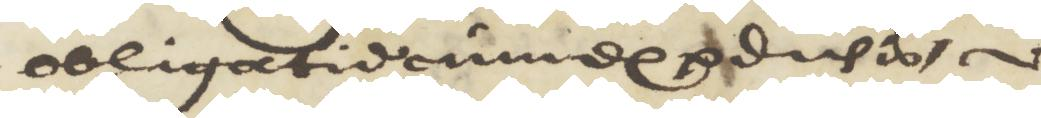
obligatie cum expenis —
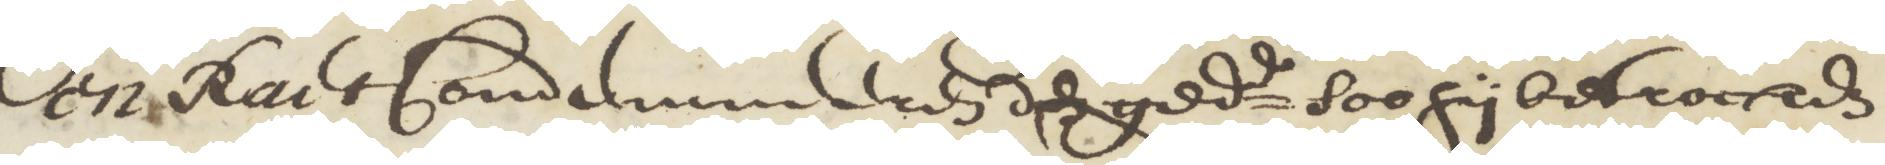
Den Raet Condemneeren den ged=e soo hij betrocken
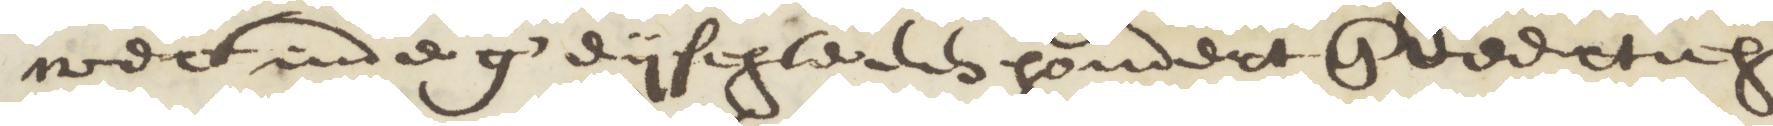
wert inde g’eijschte een hondert ende veertich
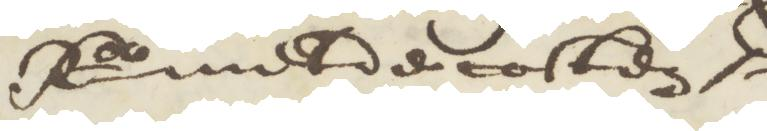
R=a met de costen/
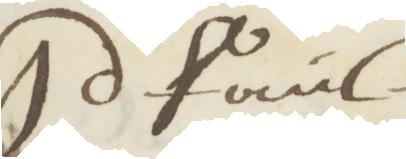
1 d'faut
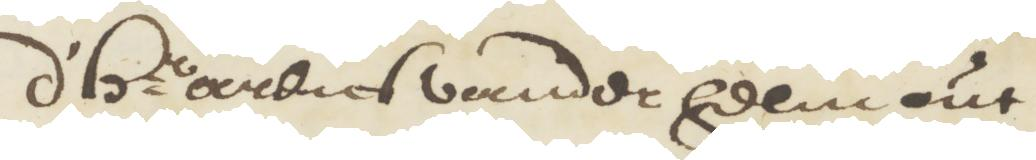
d’ h=r arent vander helmout
